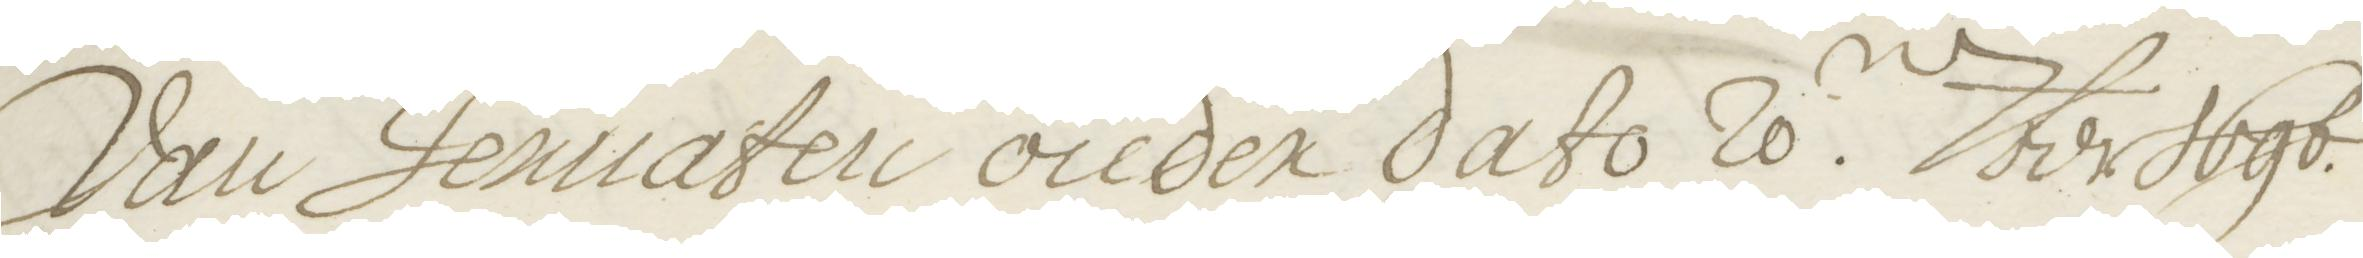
Van Ternaten onder dato 20:en 7ber 1696.
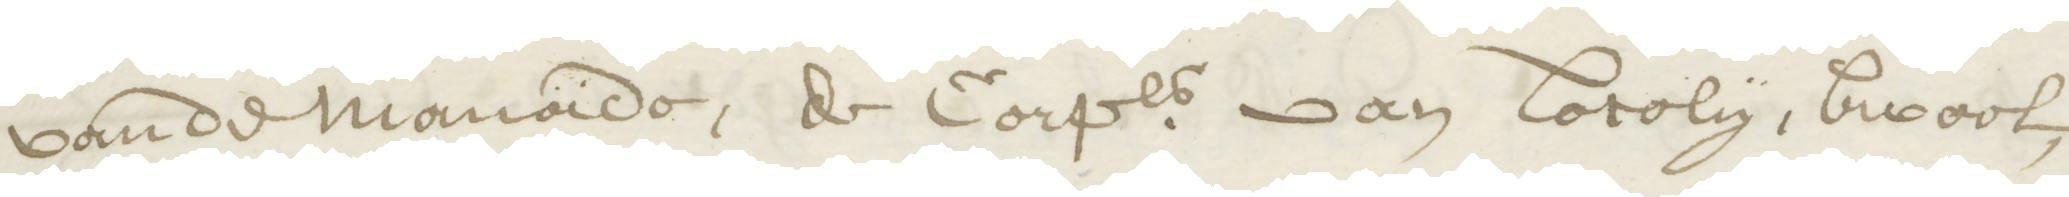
van de manado, de Corp:ls van Totolij, bwool,
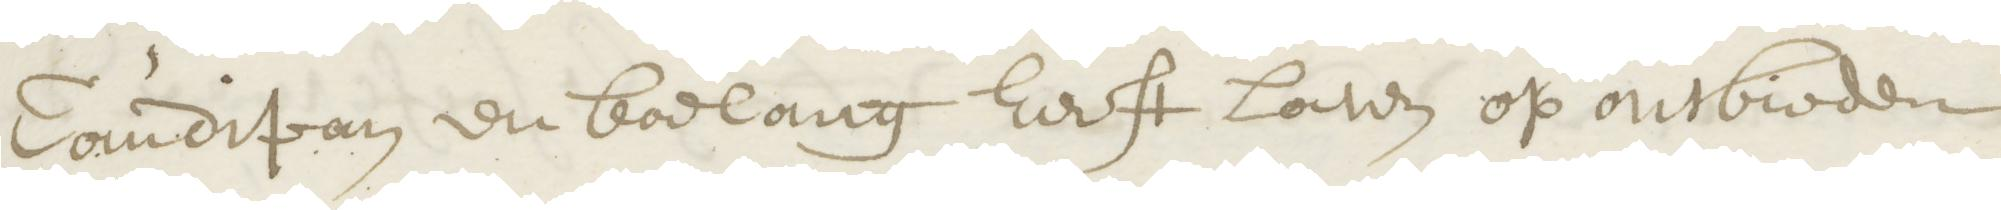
Caudipan en boelang heeft laten op ontbieden
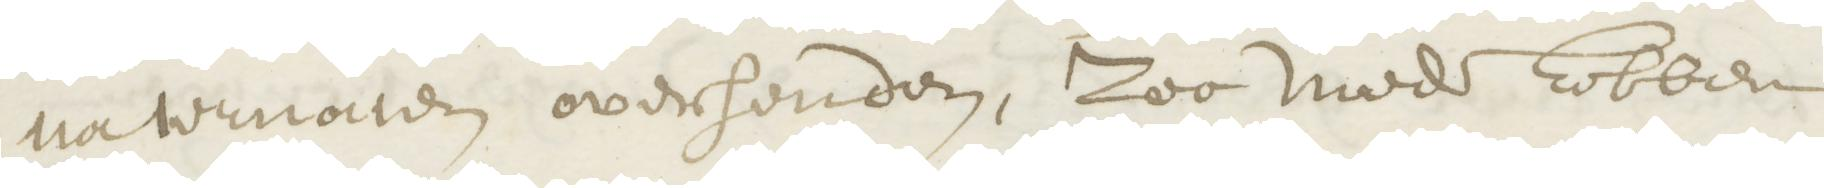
na ternaten oversenden, zoo mede hebben
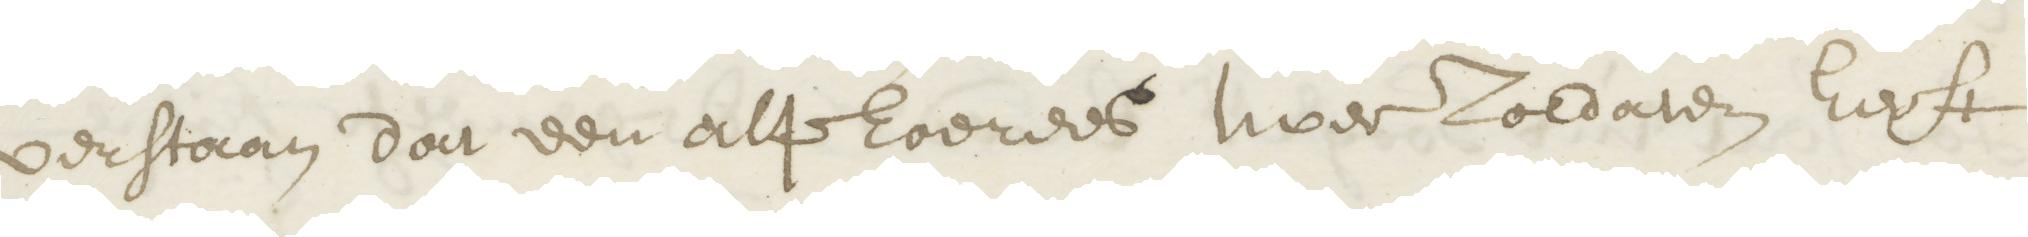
verstaan dat een alphoerees twee zoldaten heeft
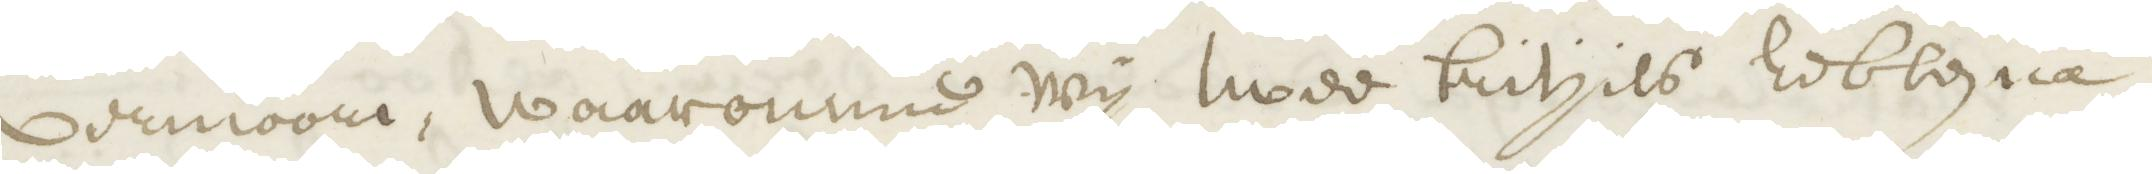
vermoort, waaromme wij twee kitjils hebben na
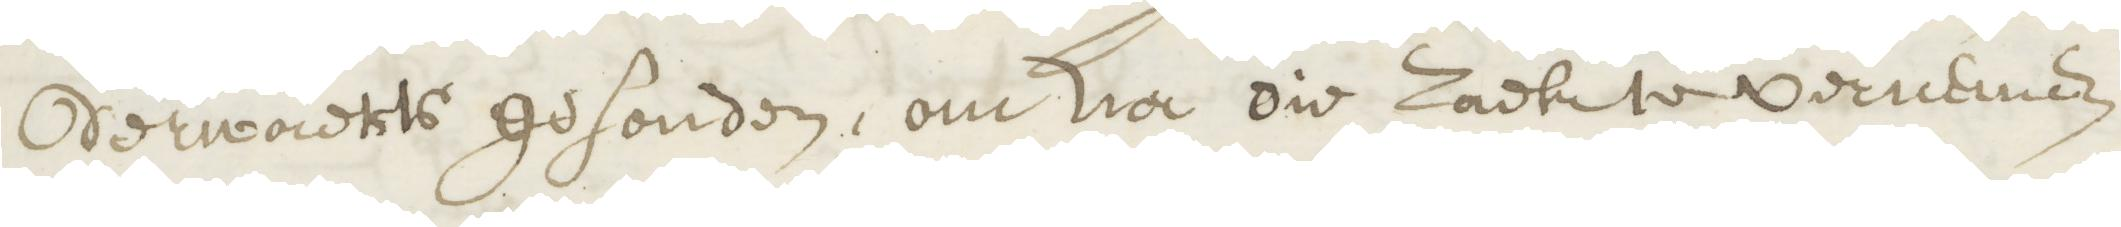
derwaerts gesonden, om na die zaek te vernemen
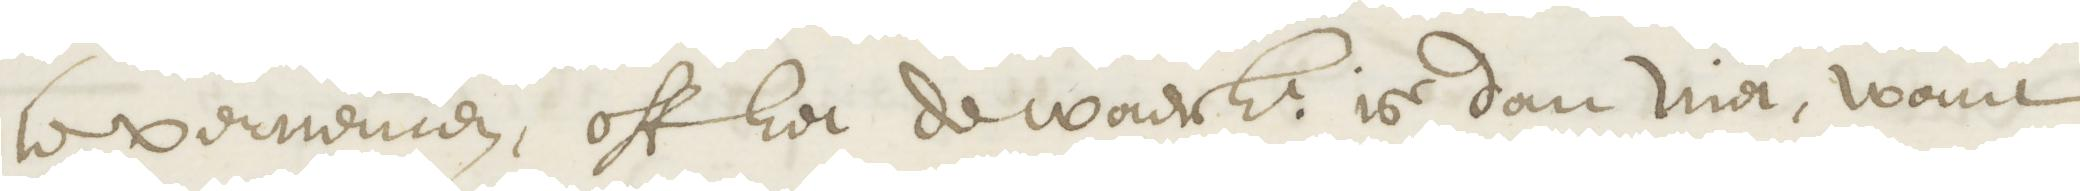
te vernemen, off het de waerh:t is dan niet, want
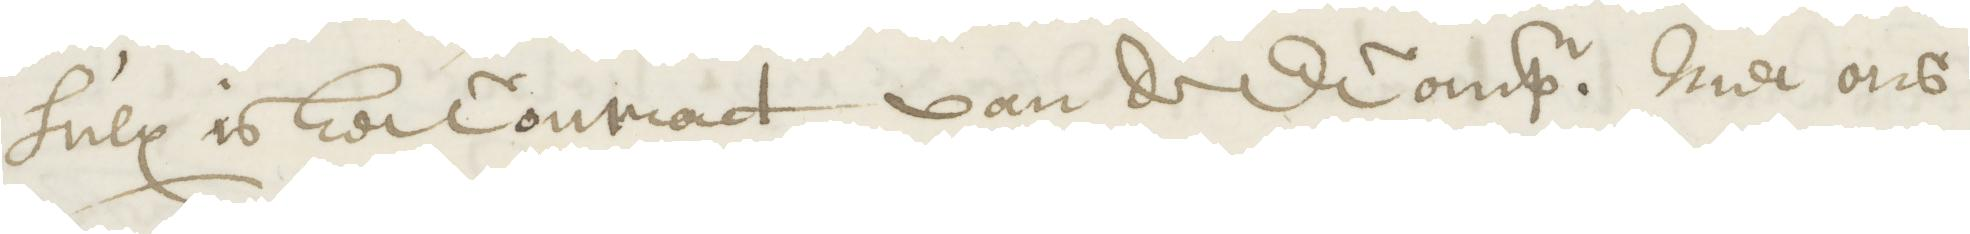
sulx is het Contract van de EComp.s met ons
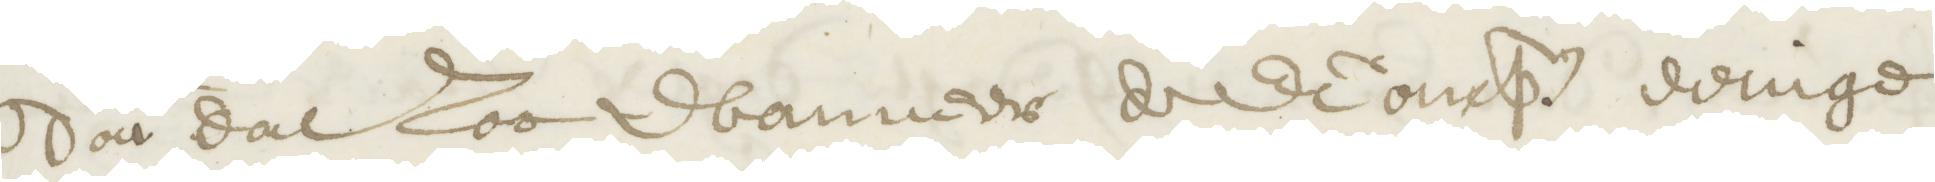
dat dat zoo wanneer de EComp:s eenige
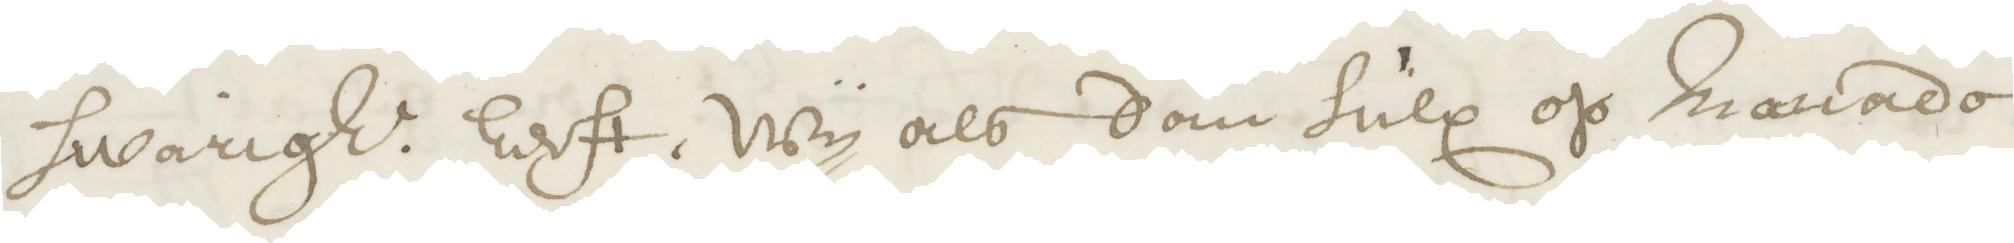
swarigh:t heeft, wij als dan sulx op manado
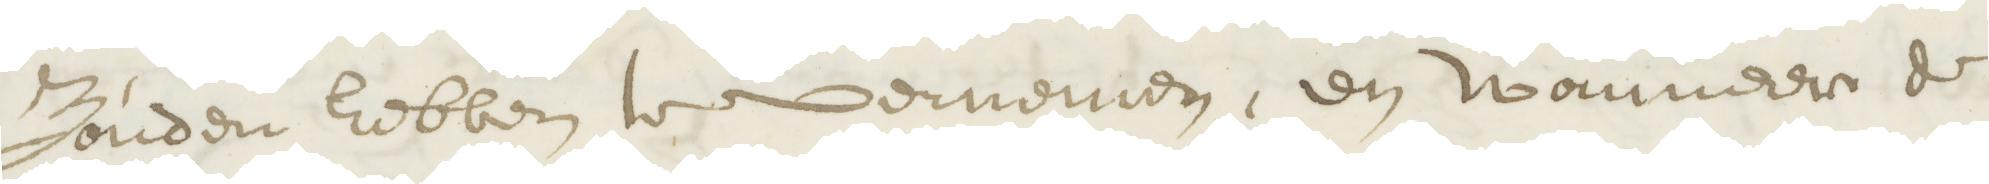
zouden hebben te vernemen, en wanneer de
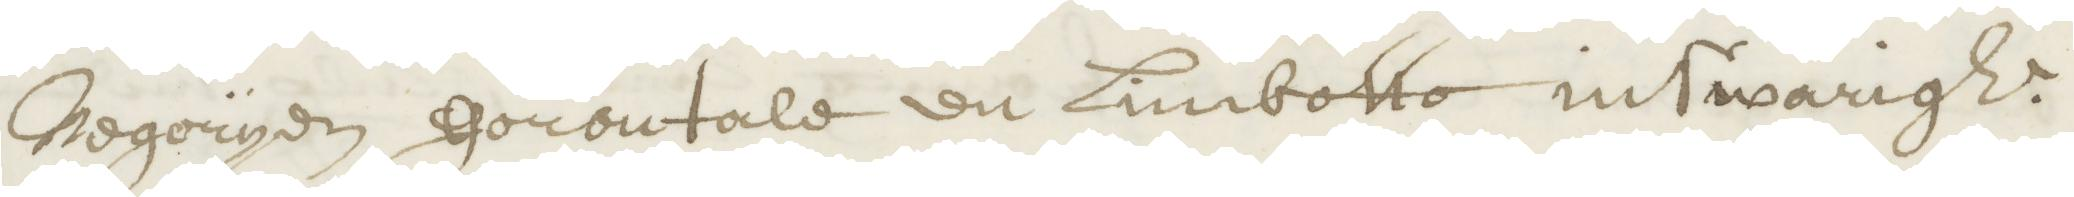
negorijen gorontale en Limbotto inswarigh.t
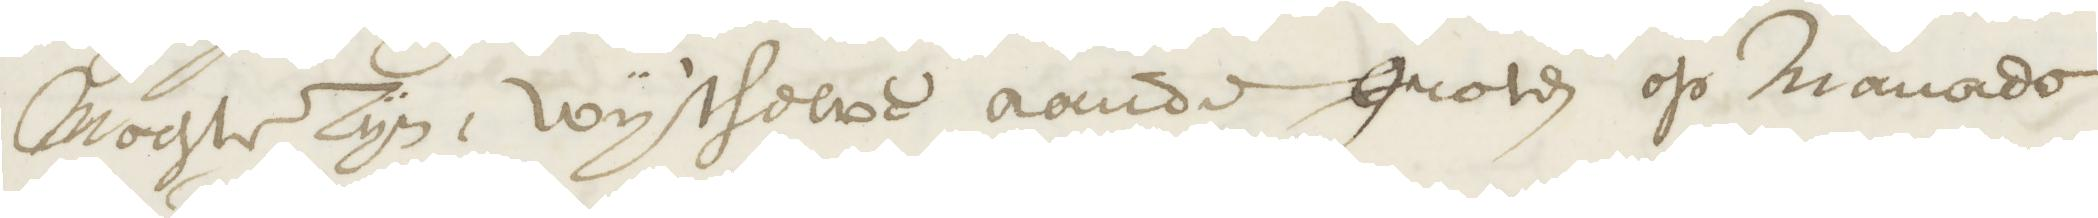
mogte zijn, wij tselve aande groten op Manado
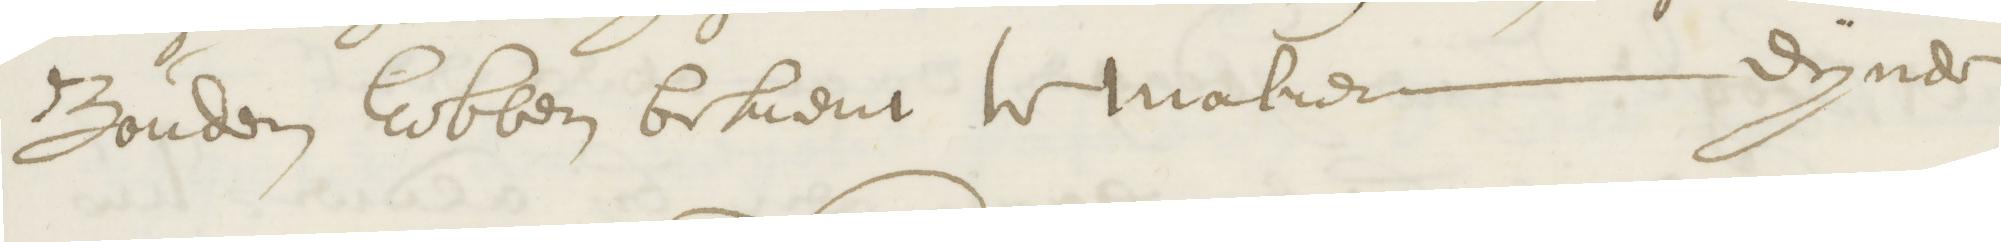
zouden hebben bekent te maken eijnde
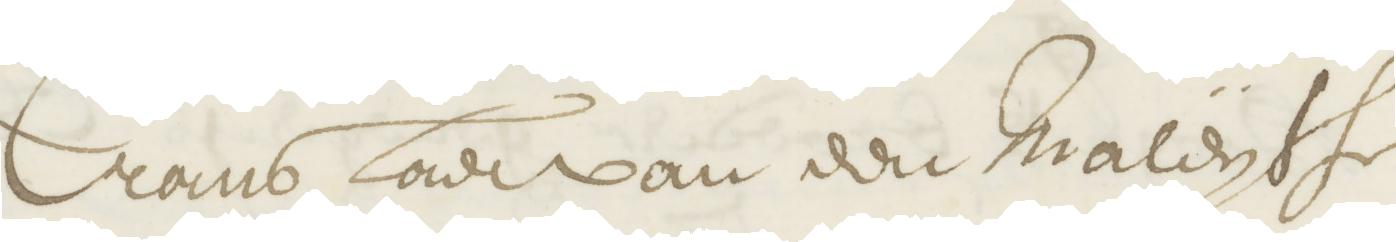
Translaet van een maleijsse
